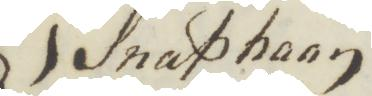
1 Snaphaan
